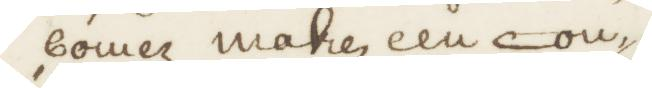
„bomen maken een con„
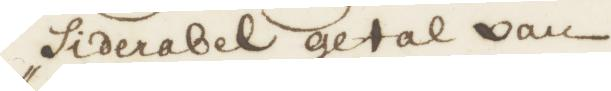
„siderabel getal van
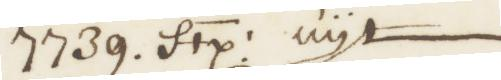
7739. stx: uijt
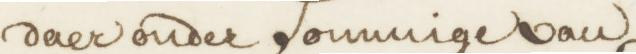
daer onder sommige van
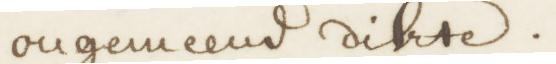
ongemeene dikte.
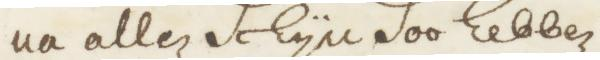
na allen schijn soo hebben
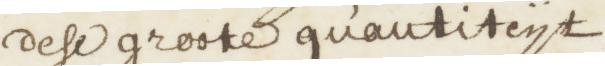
dese groote quantiteijt
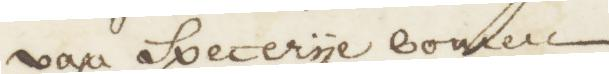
van specerije bomen
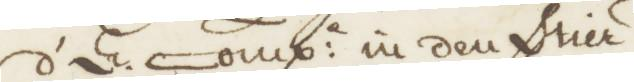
d’ E: comp:e in den vertier
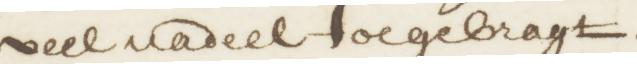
veel nadeel toegebragt.
